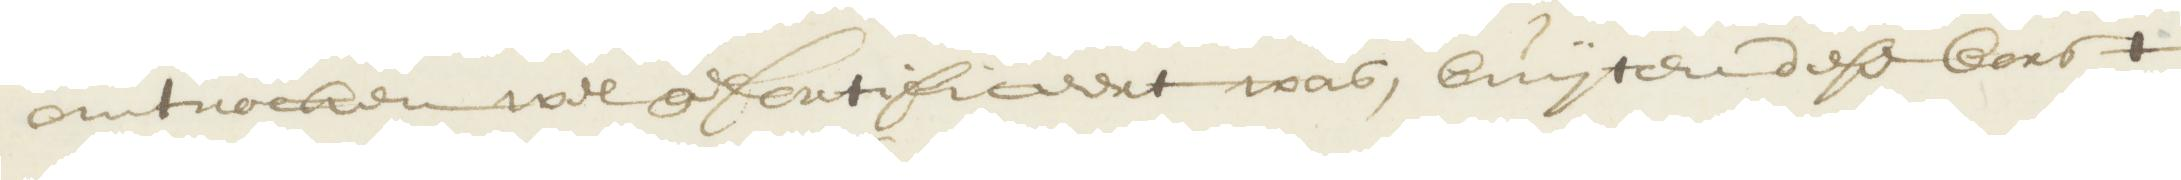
ontrocken wel gefortificeert was, buijten dese borst„
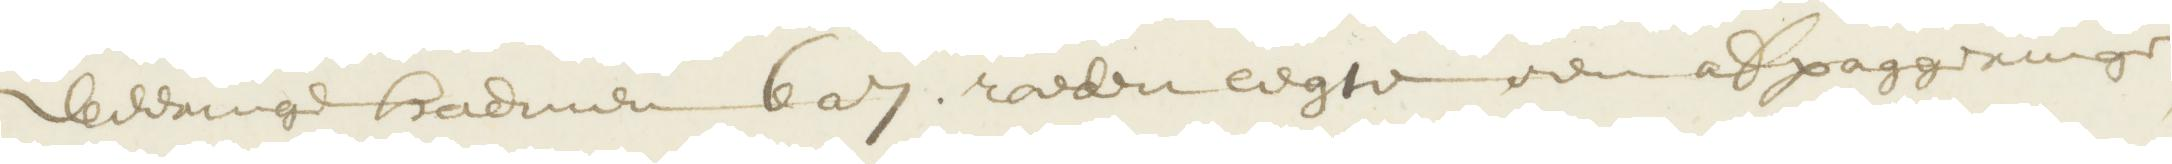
weeringe hadmen 6 a7. roeden legte een afpaggeringe
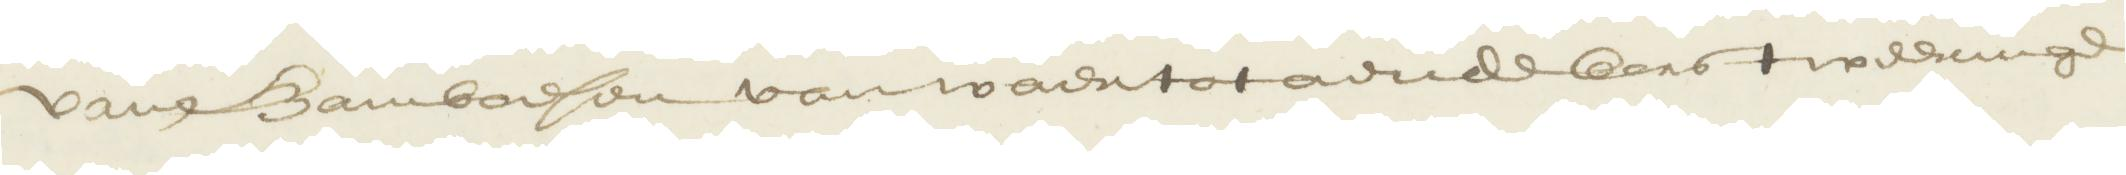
vanBamboesen van waer tot aende borstweeringe
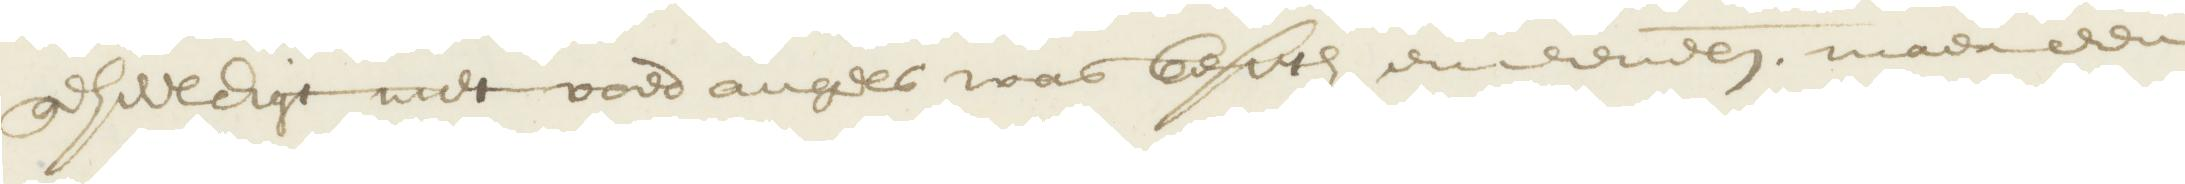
geheeldigt met voed angels was beseth en eenelijk, maer een
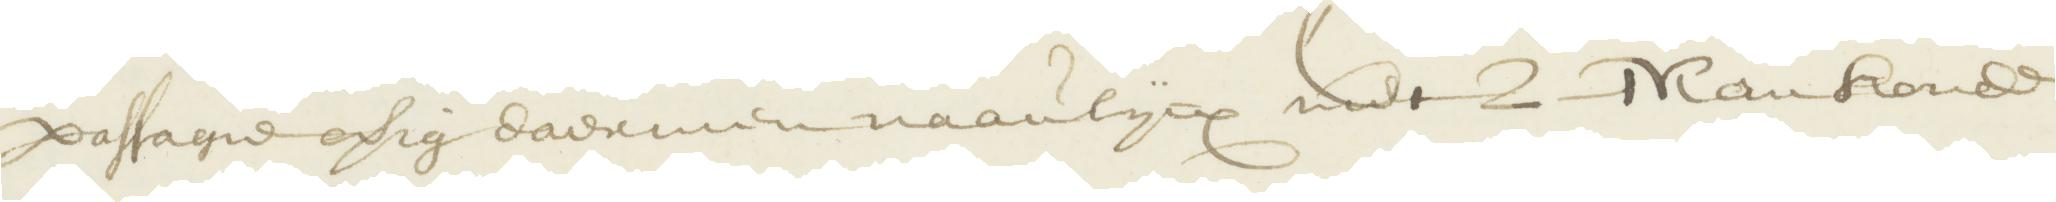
passagie overig daer men naaulijcx met 2 Man konde
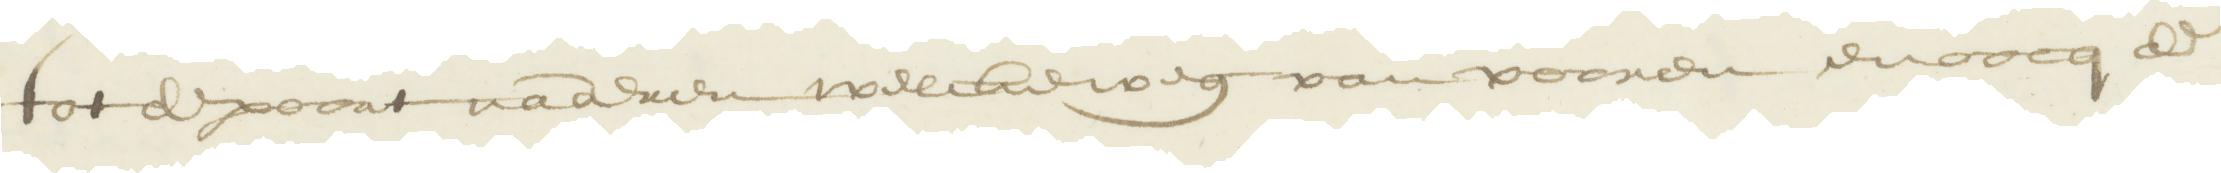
tot depoort naderen welckeweg van vooren enoocq de
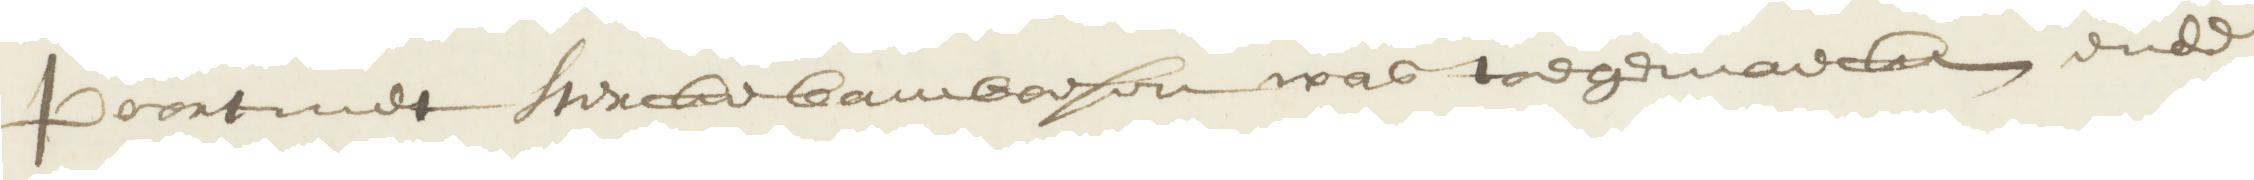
poortmet stercke bamboesen was toegemaect ende
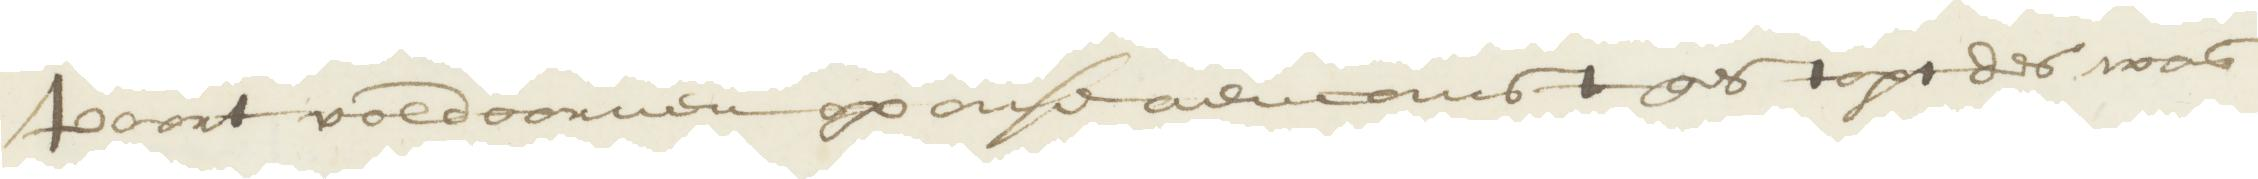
poort voldoornen op onse aencomst gestopt des was
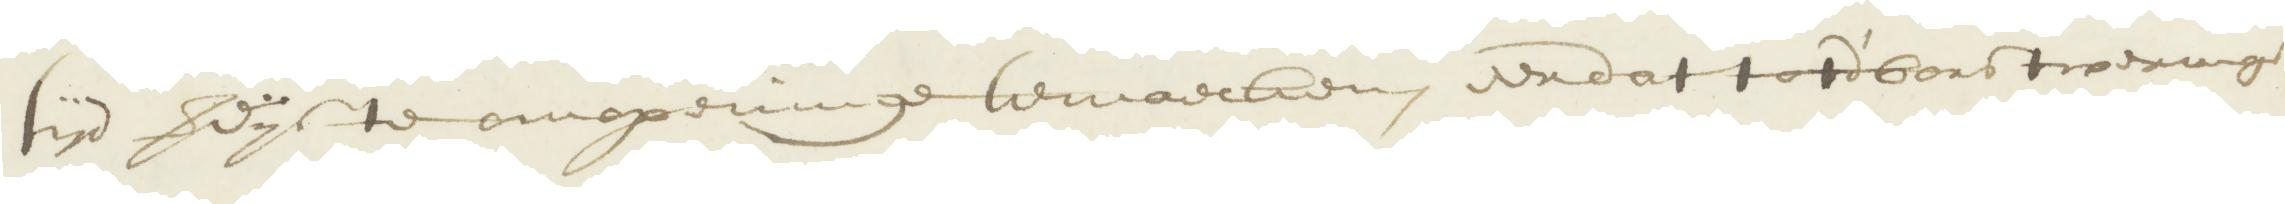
tijd vereijste omopeninge temaecken, eerdat totd´borstweringe
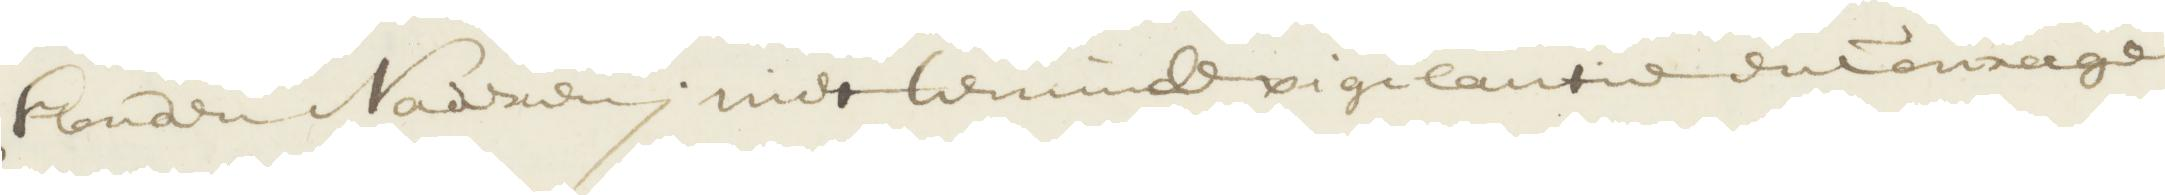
konden Naderen; niet teminde vigilantie enCourage
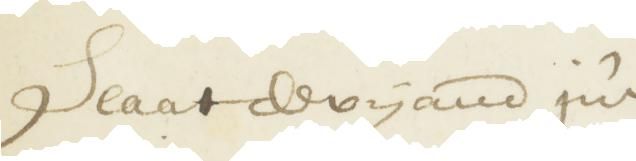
Verlaat devijand jn´t
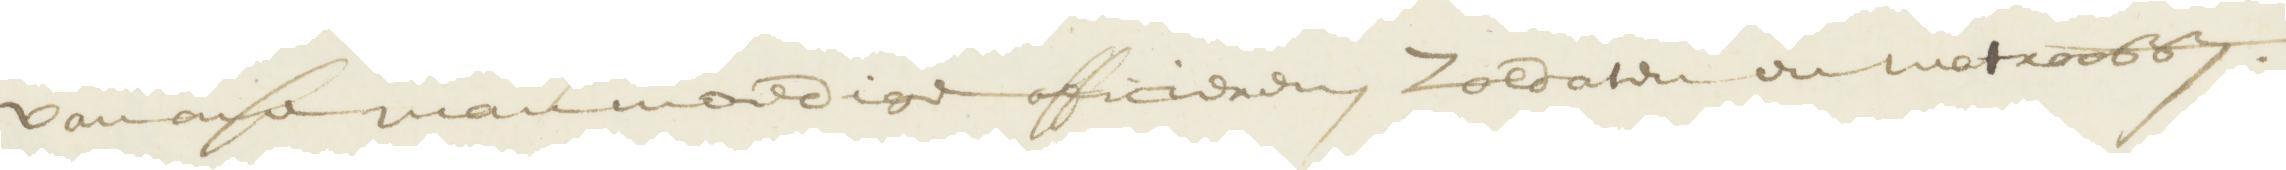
van onse manmoedige officieren, zoldaten en matroossen.
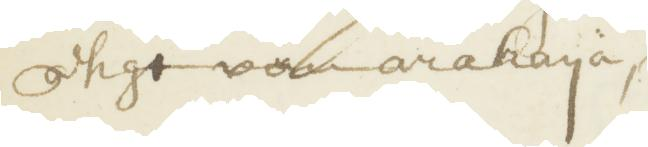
gesigt van arakaija,
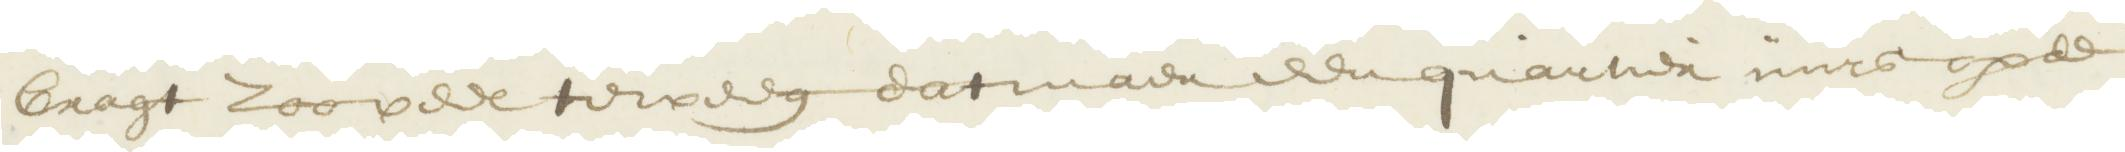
bragt zooveel te weeg datmaer een quartier uurs opde
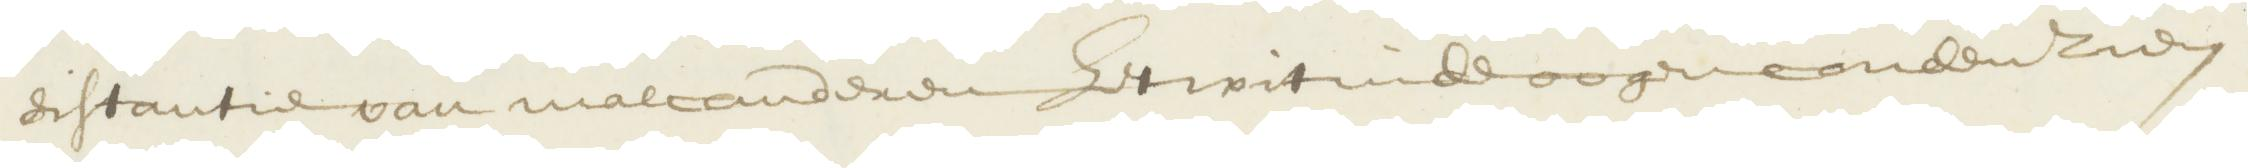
distantie van malcanderen hetwitinde oogen conden zien
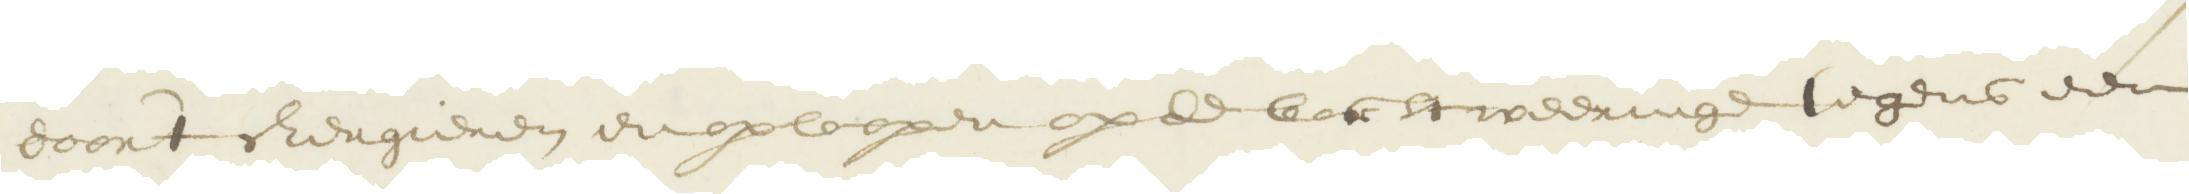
door’t chergieren en oploopen op de borstiweeringe tegens een
